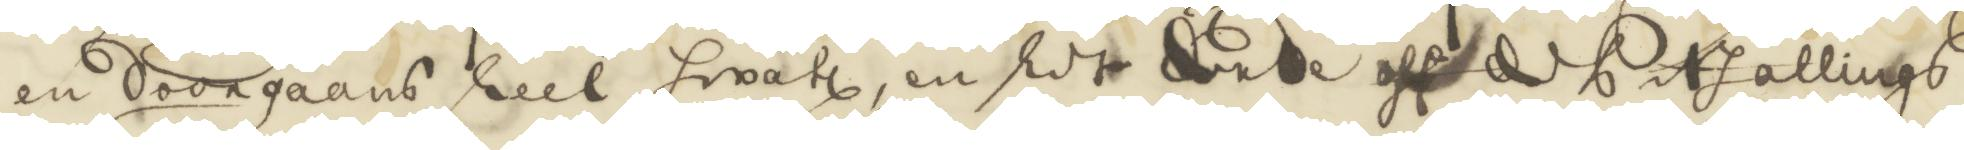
en doorgaans heel swak, en het derde off de Pitjallings
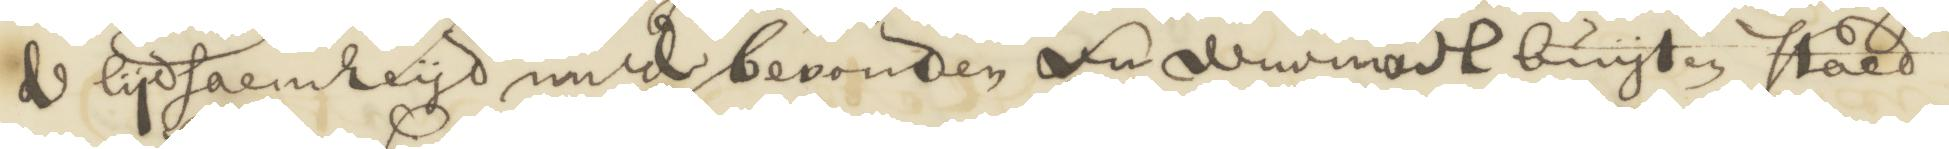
de lijdsaemheijd mede bevonden ten eenemael buijten Staed
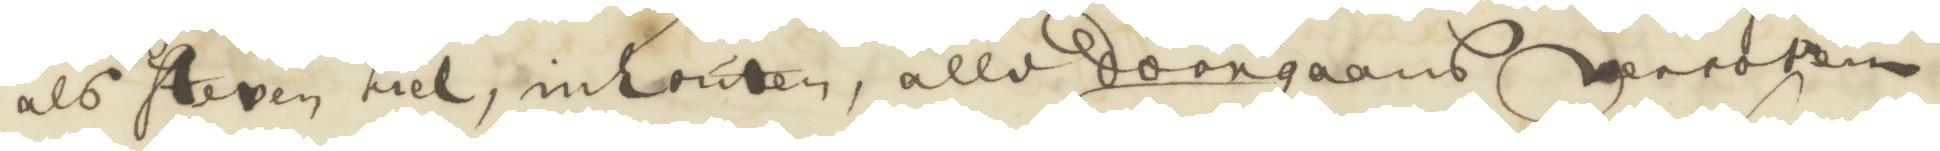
als steven kiel, inhouten, alle doorgaans verrot en
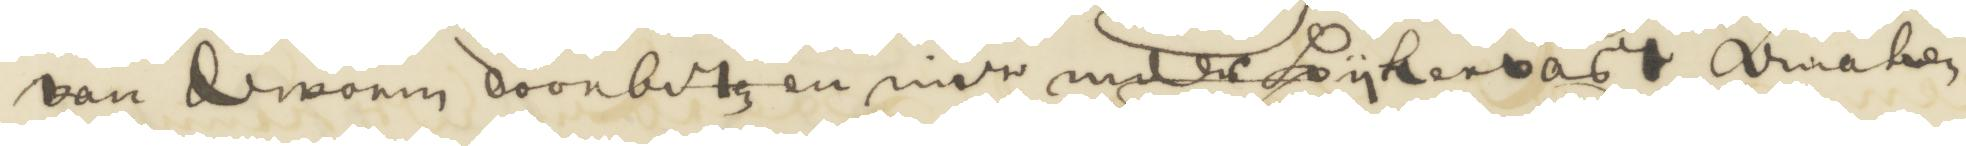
van de worm doorbeten niet meer spijkervast te maken
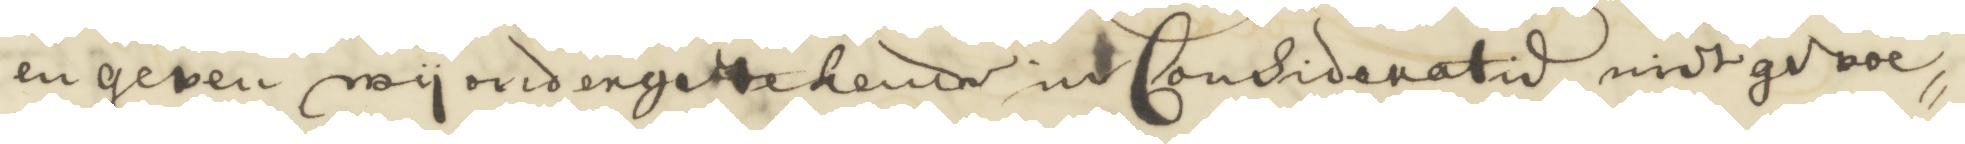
en geven wij ondergetekende, in Consideratie niet gevoe„
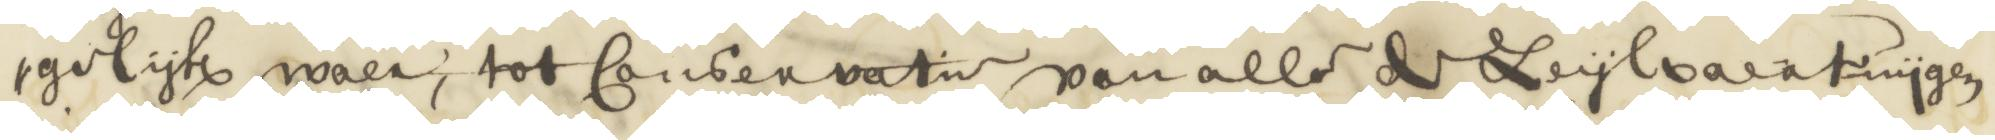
gelijk waer, tot Conservatie van alle de Zeijlvaertuijgen
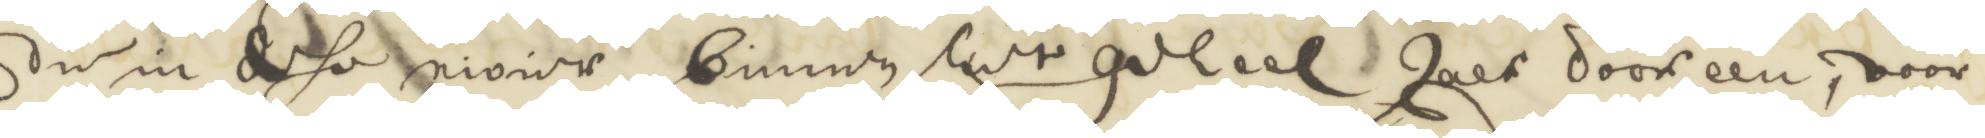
die in dese rivier binnen het geheel jaer door een, voor
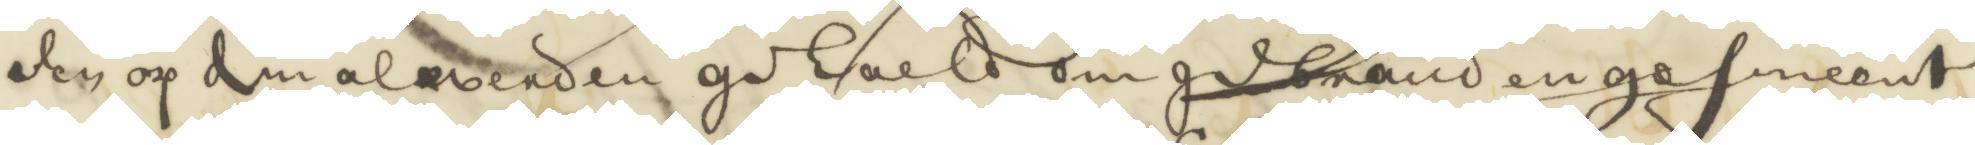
Een op de wal werden gehaeld om gebrand en gesmeert
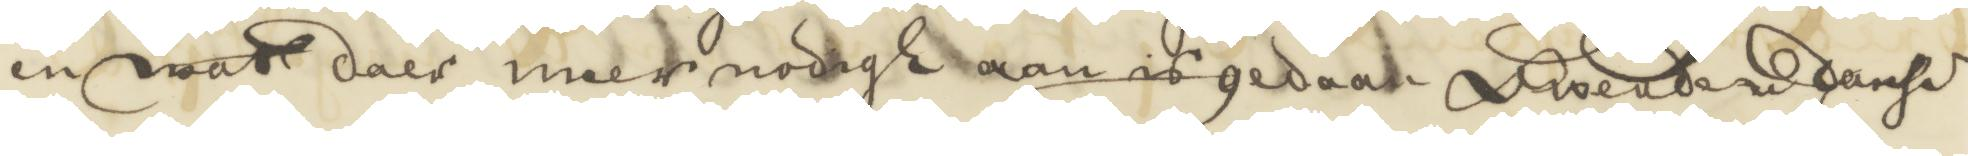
en wat daer meer nodigh aan is gedaan te werden dan se
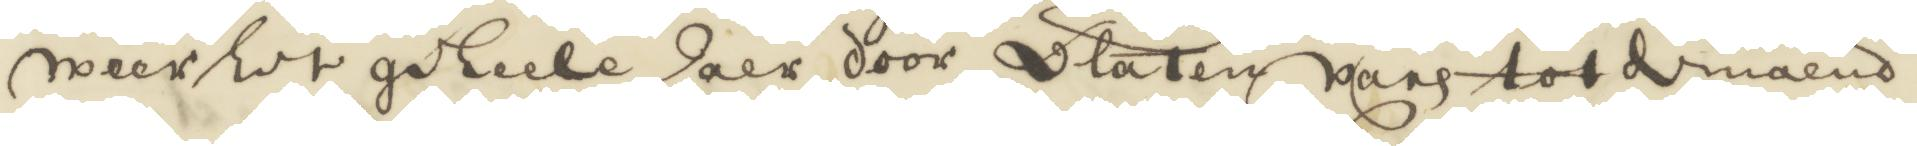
weer het geheele Jaer door te laten varen tot de maend
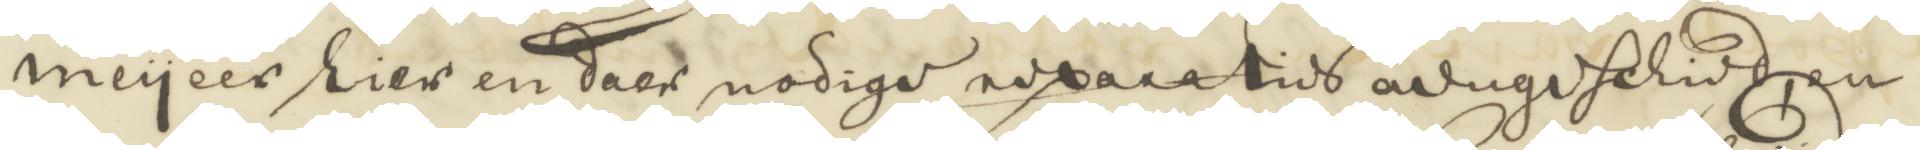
meij eer hier en daar nodige reparaties aen geschied, en
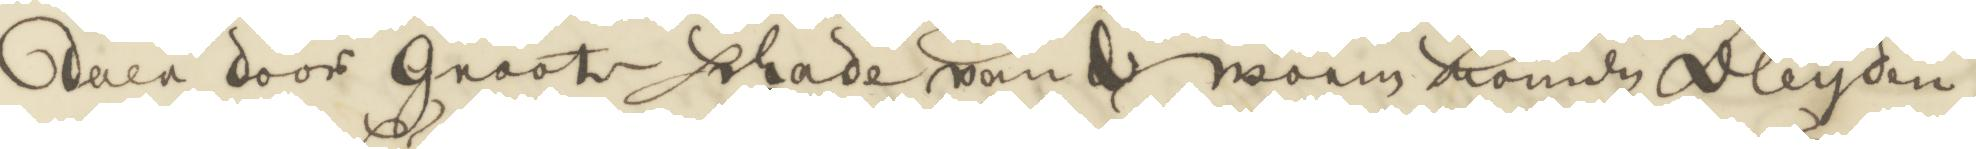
daer door groote schade van de worm komen te leijden
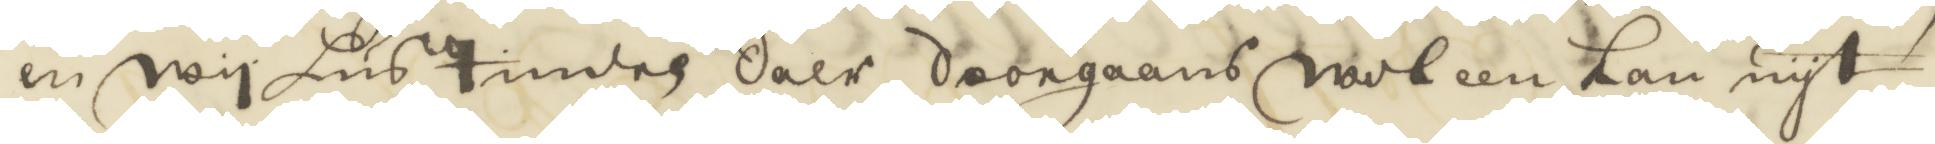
en wij Sustineren daer doorgaans wel een kan uijt
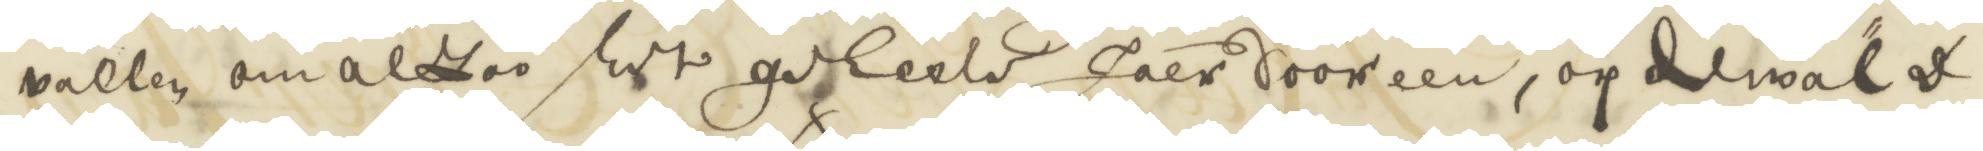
vallen om alzoo het geheele Jaer door een, op de wal te
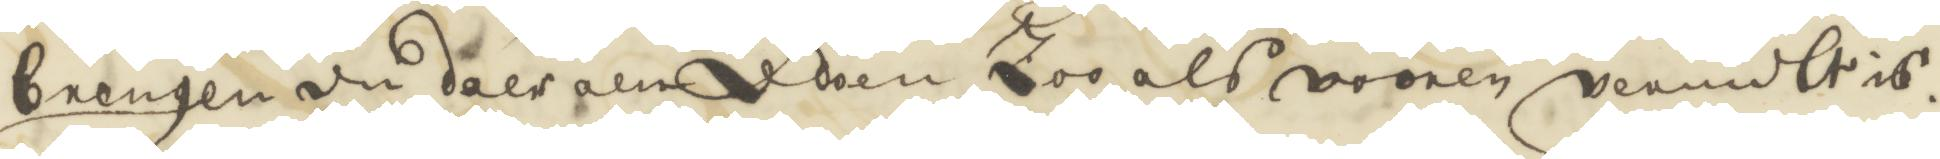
brengen en daer aen te doen Zoo als vooren vermelt is.
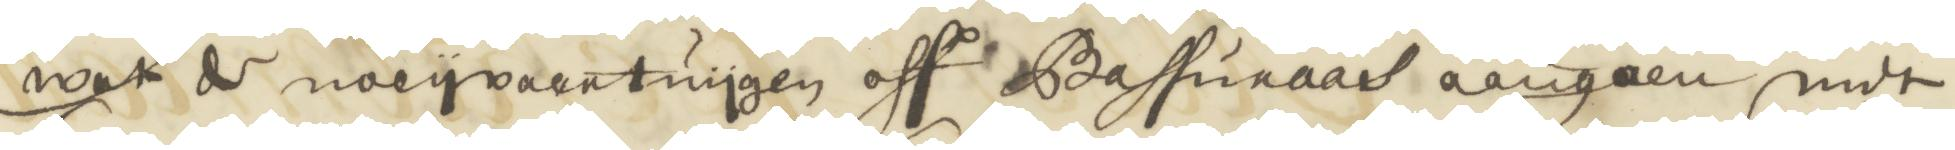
wat de roeijvaartuijgen off Bassuraas aangaen met
